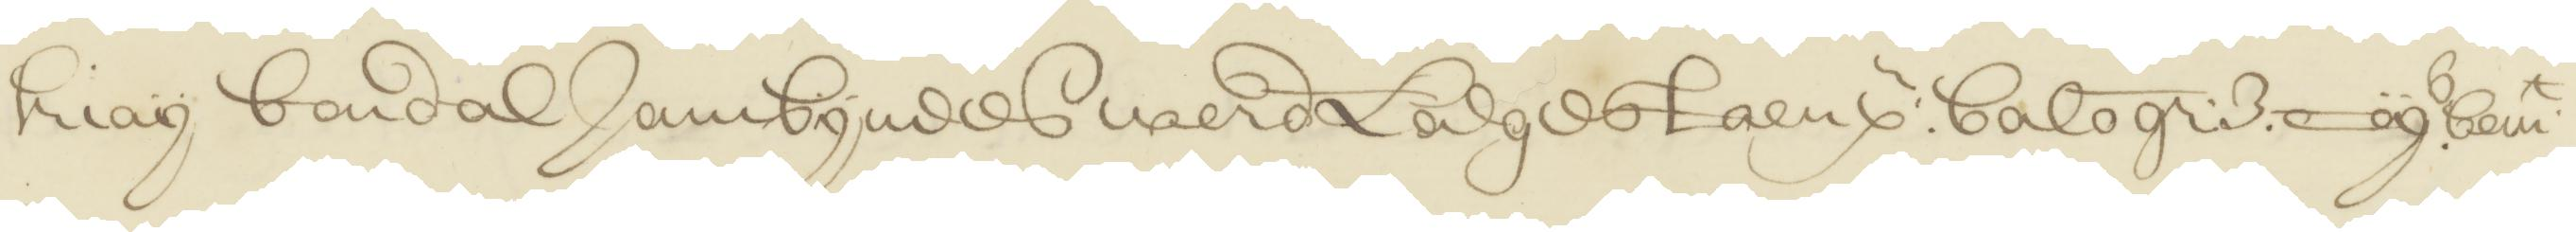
kiaij bondal Jambijnees werd toegestaen p:r balo gr. 3. coij.s bem:t
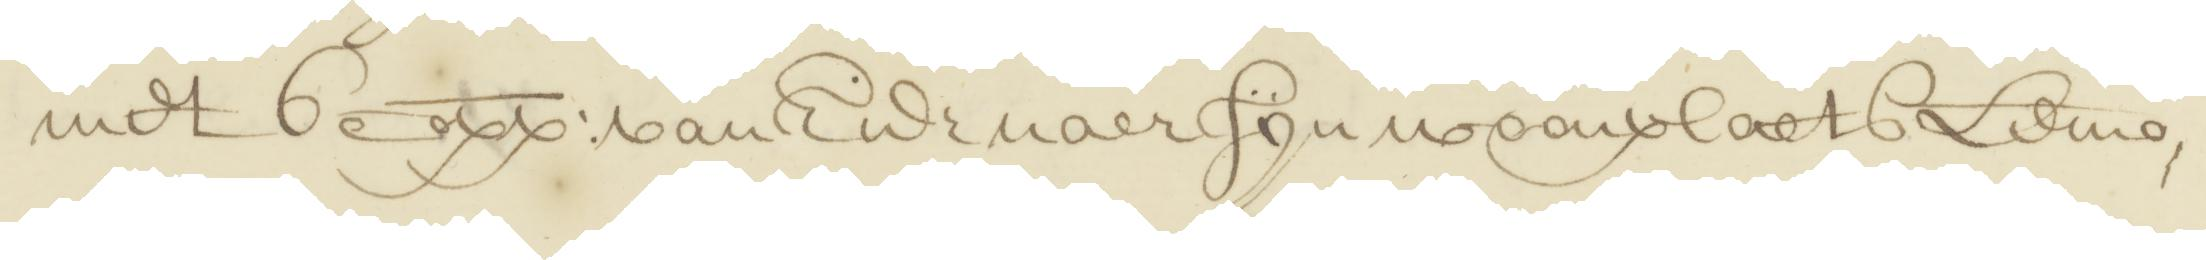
met 6 copp: van hier naer sijn woonplaets temo„
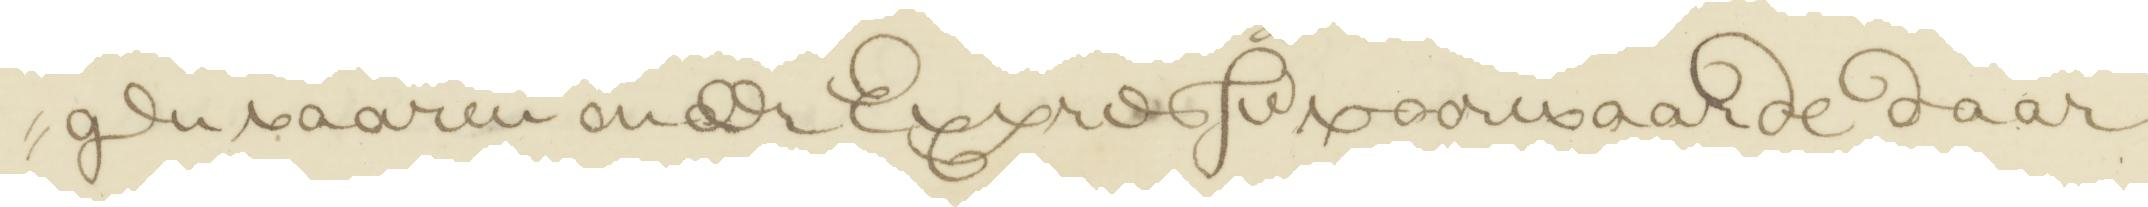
„gen vaaren onder Expresse voorwaarde daar
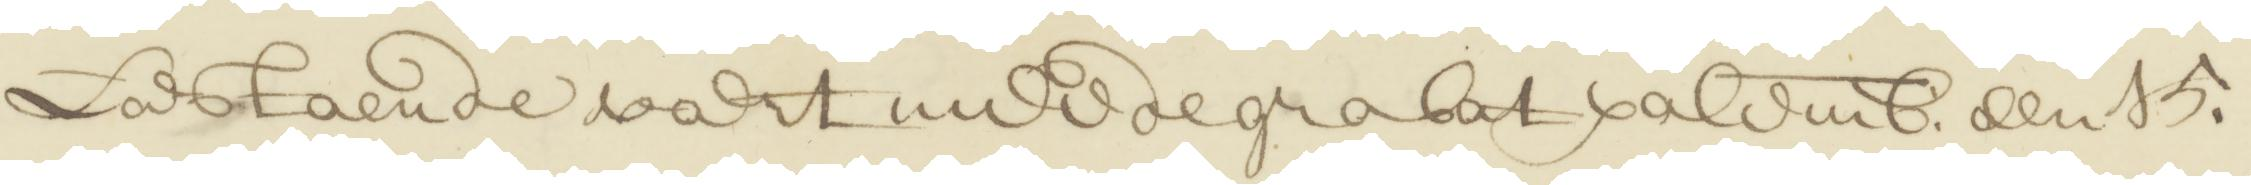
toestaende voert meede grabat palemb: den 15.
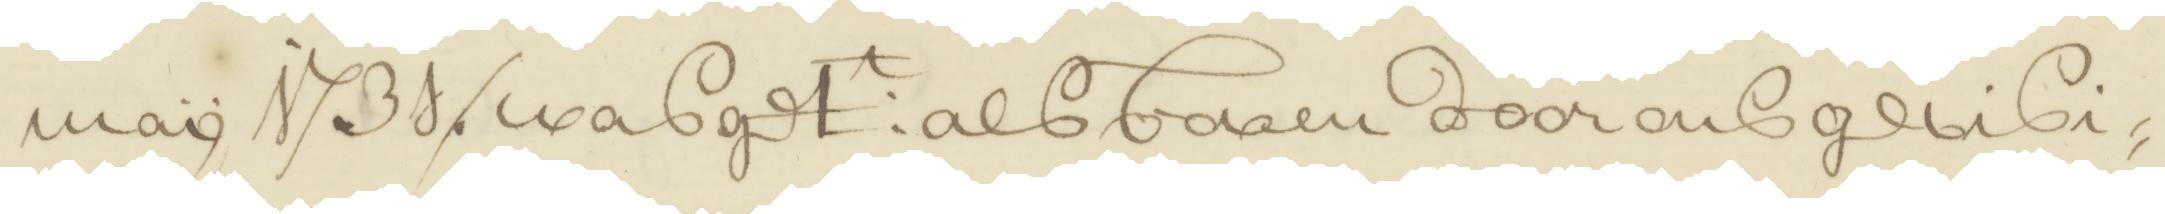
maij 1731/. was get:t als boven door ons gevisi„
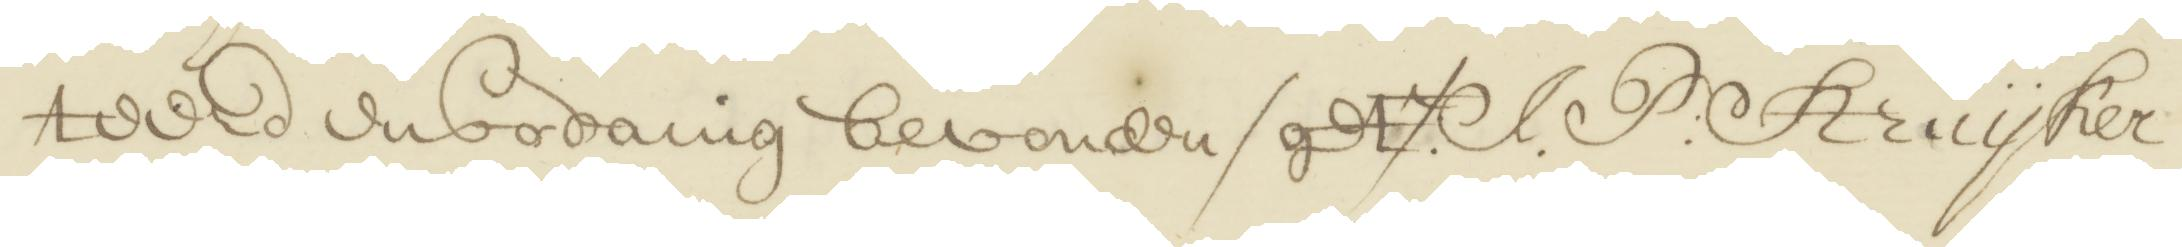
teerd en sodanig bevonden /get/:t I: P: Struijker
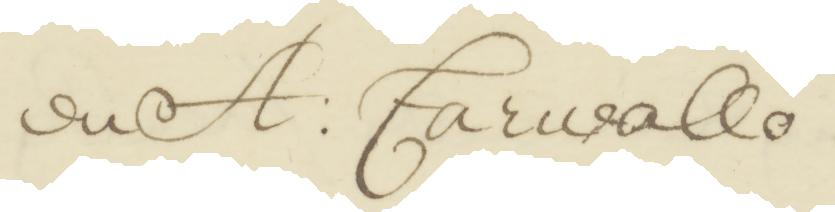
en A: Carwallo
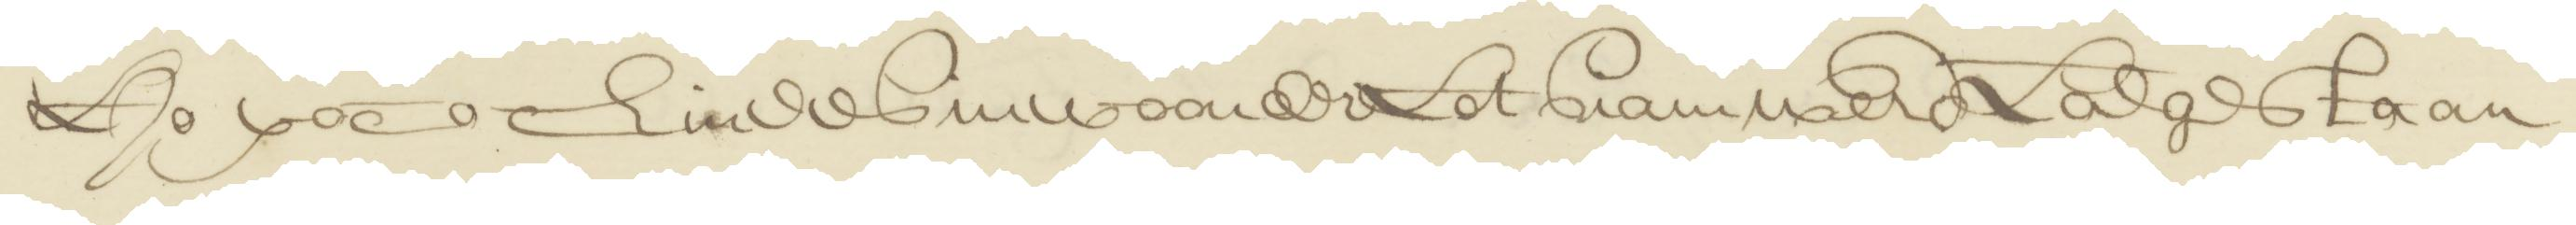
tJo poco chinees inwoonder tot siam werd toegestaan
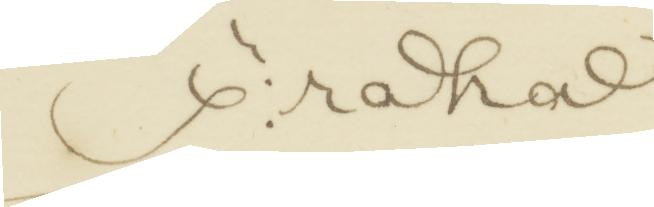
p:r roekae
